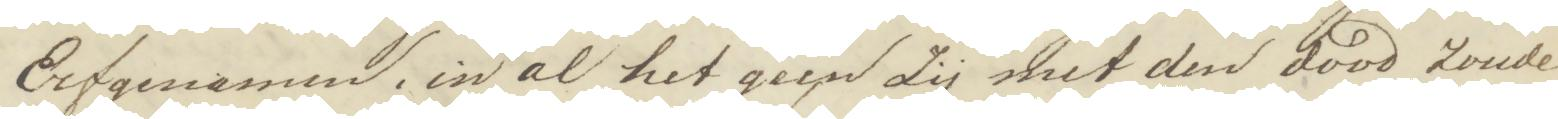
Erfgenamen, in al het geen zij met den dood zoude
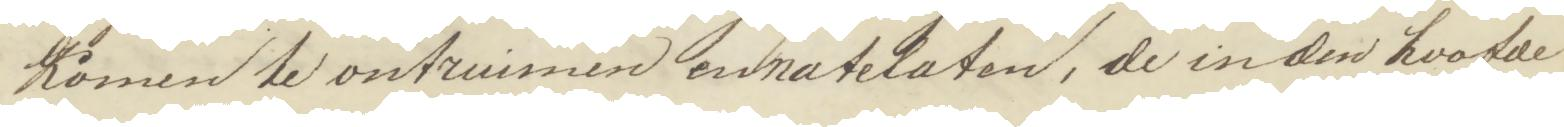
komen te ontruimen en na te laten, de in den hoofde
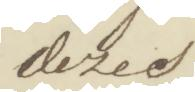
dezes
